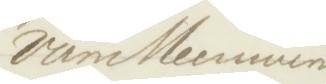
van Meeuwen
